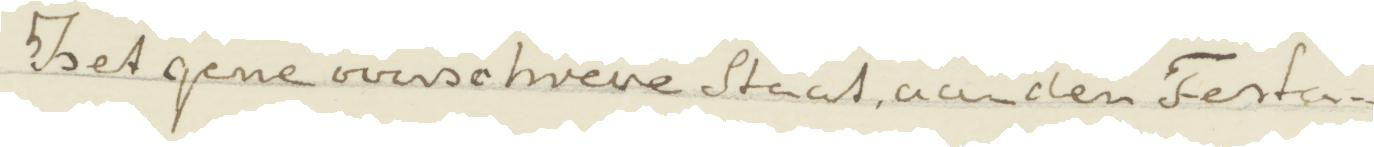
het gene voorschreve staat, aan den Testa-
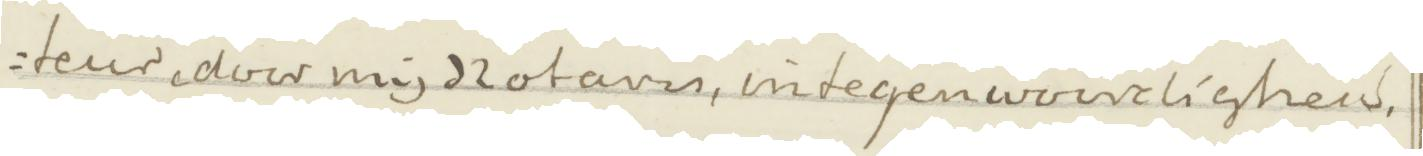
=teur door mij Notaris in tegenwoordigheid,
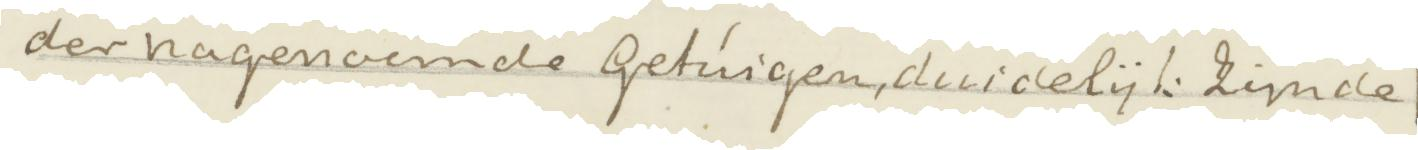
der nagenoemde Getuigen, duidelijk zijnde
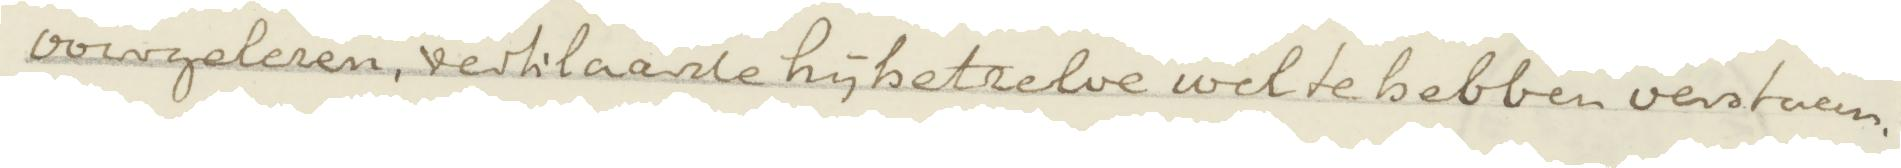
voorgelezen, verklaarde hij hetzelve wel te hebben verstaan,
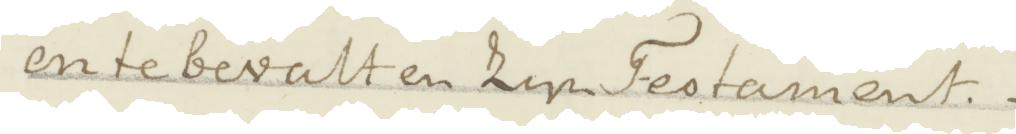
en te bevatten zijn Testament.
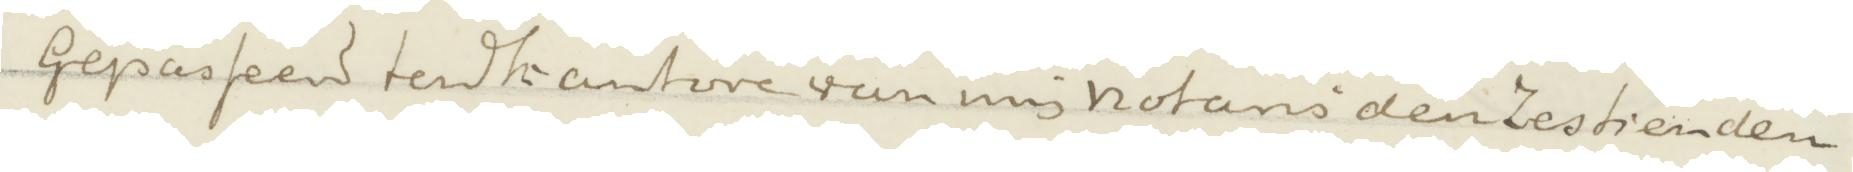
Gepasseerd ten kantore van mij notaris den zestienden
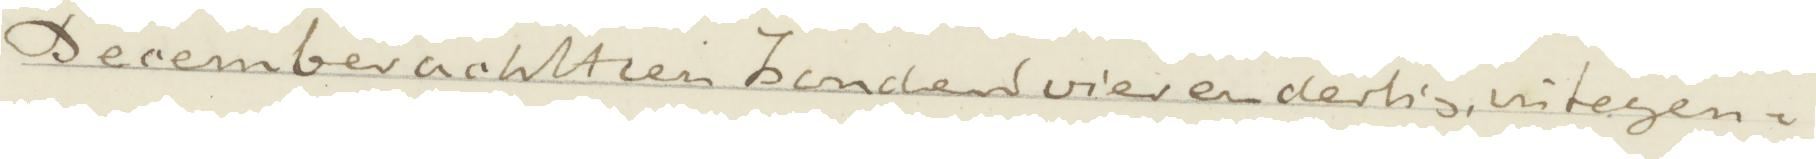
December achttien honderd vier en dertig, in tegen-
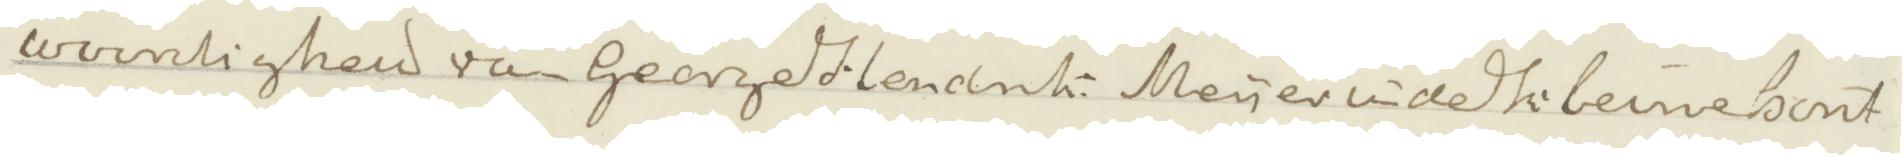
woordigheid van George Hendrik Meijer in de kleine hout
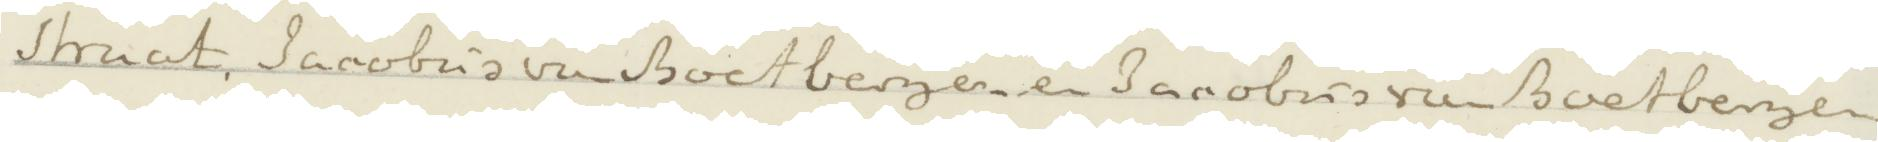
straat, Jacobus van Boetbergen en Jacobus van Boetbergen
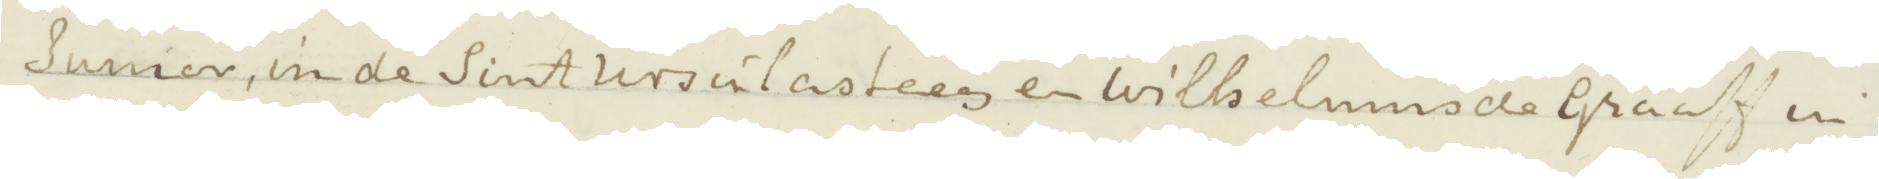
Junior, in de sint ursulasteeg en wilhelmus de Graaff in
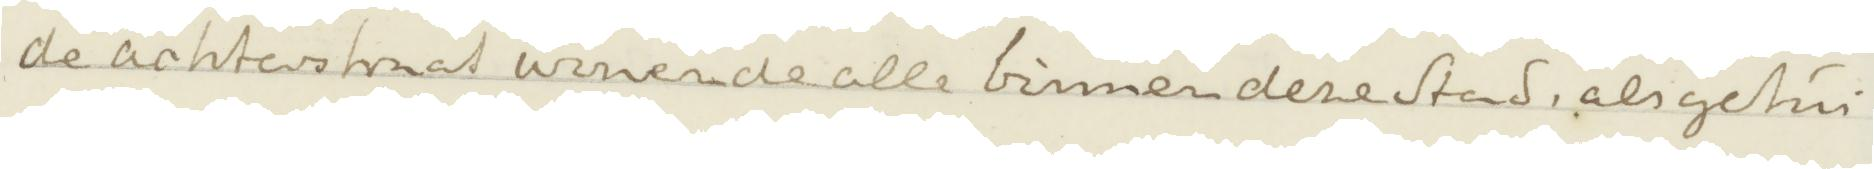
de achterstraat wonende alle binnen deze stad, als getui
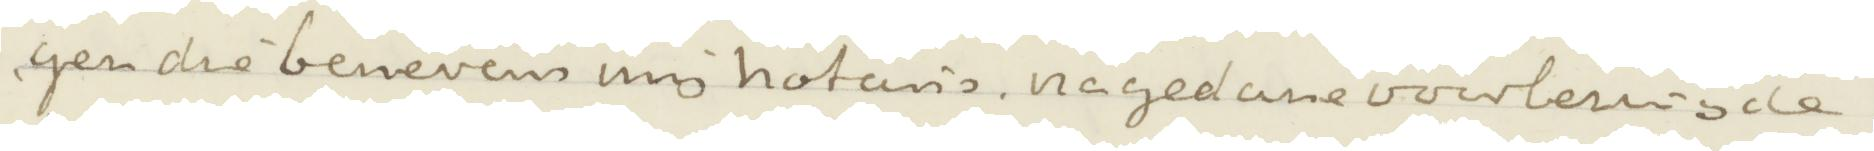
,gen die benevens mij notaris, nagedane voorlezing de
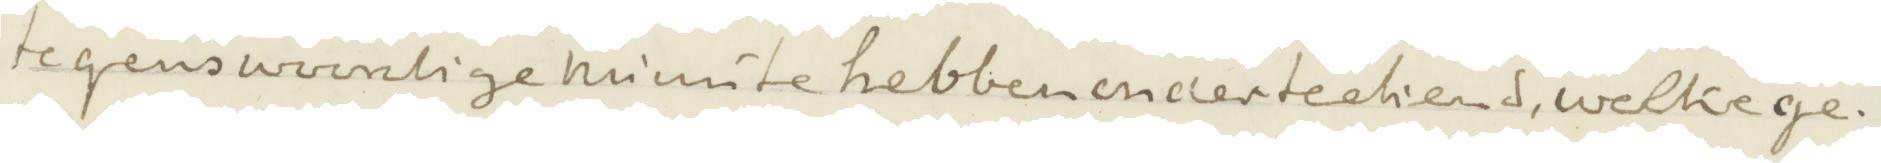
tegenswoordige minute hebben onderteekend, welke ge.
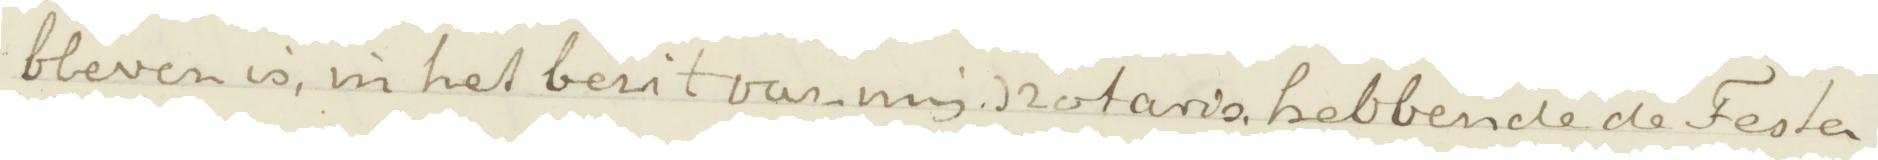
bleven is, in het berit van mij notaris, hebbende de Testa
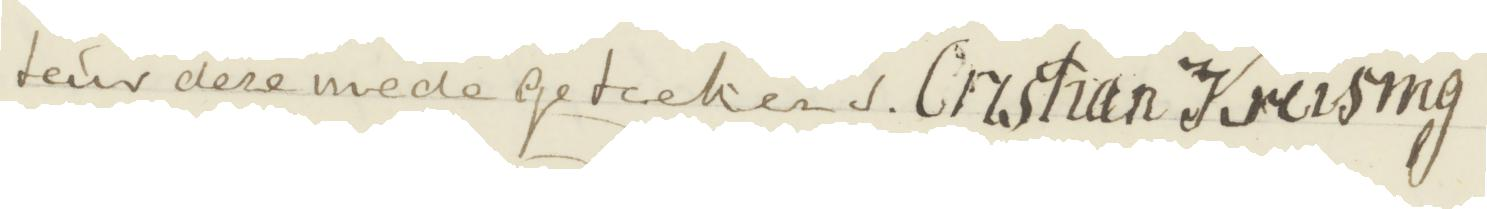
teur deze mede geteekend. Cristian Kreising
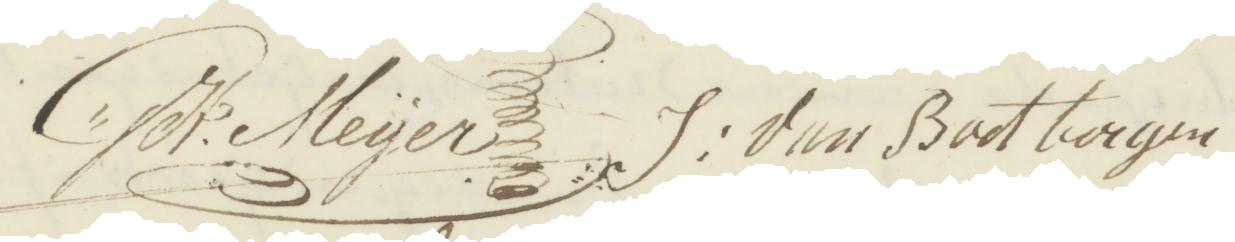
C: H: Meijer J: Van Boetbergen
